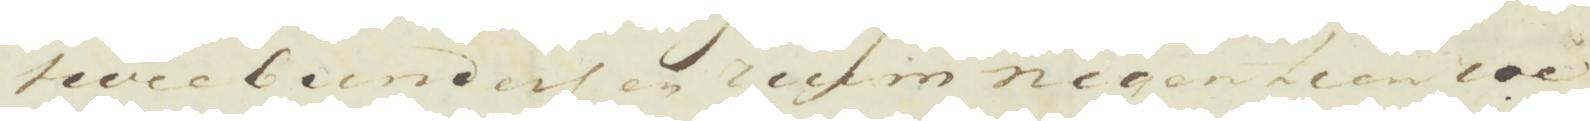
twee bunders en ruim negentien roe
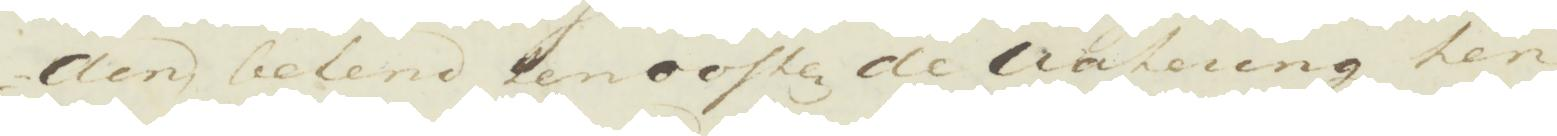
=den belend ten oosten de watering ten
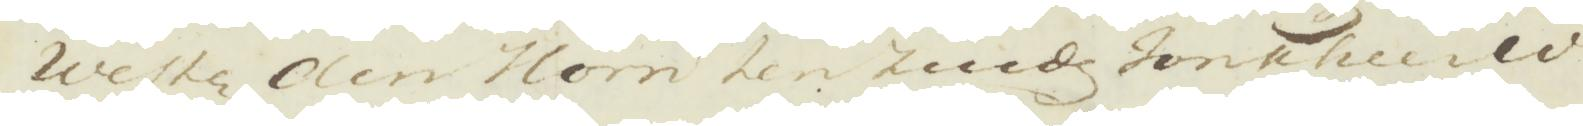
Westen den Horn ten zuiden Ionkheer W
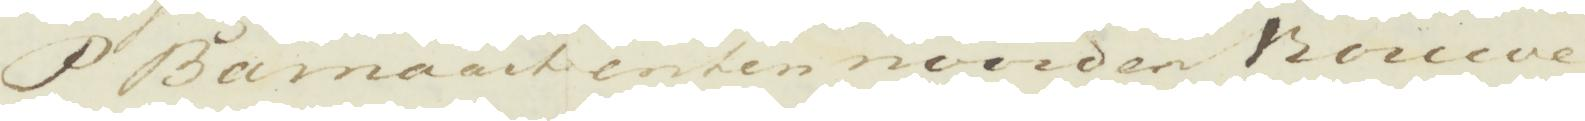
P Barnaart en ten noorden Vrouwe
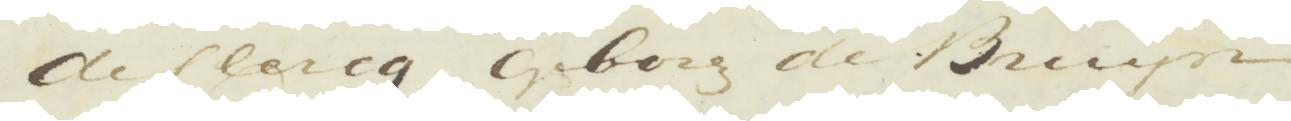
de Clercq geboren de Bruyn
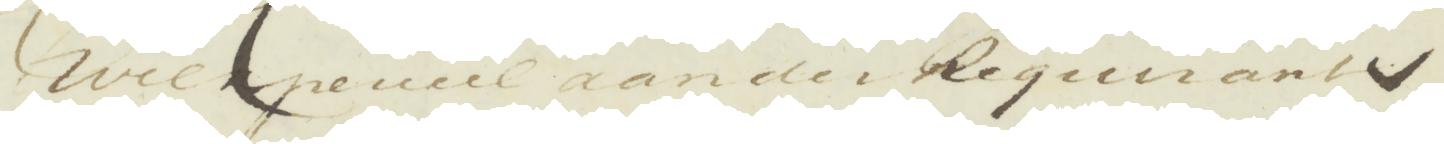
welk perceel aan der Requirants
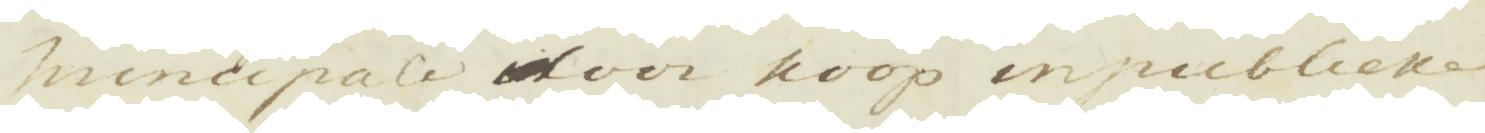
principale door koop in publieke
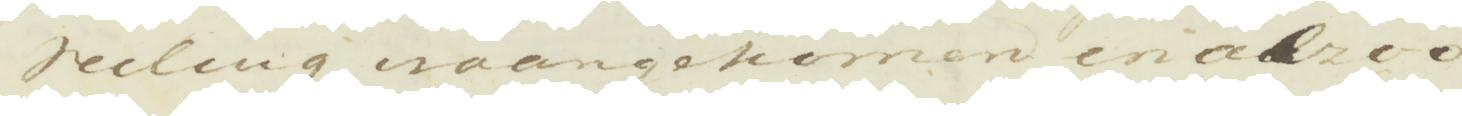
veiling is aangekomen en alzoo
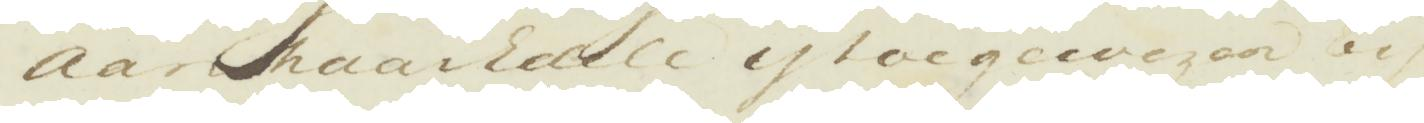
aan haar Edele is toegewezen by
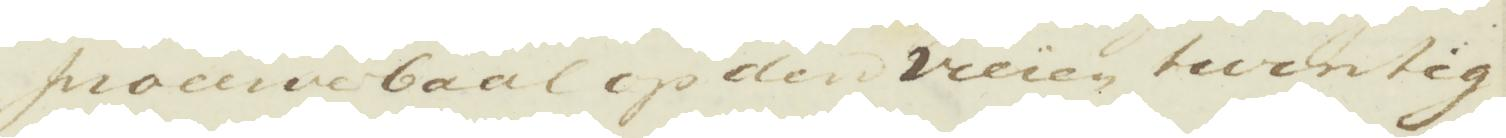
procesverbaal op den vieren twintig
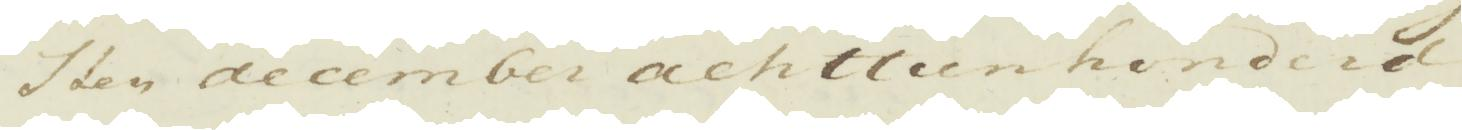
sten december achttienhonderd
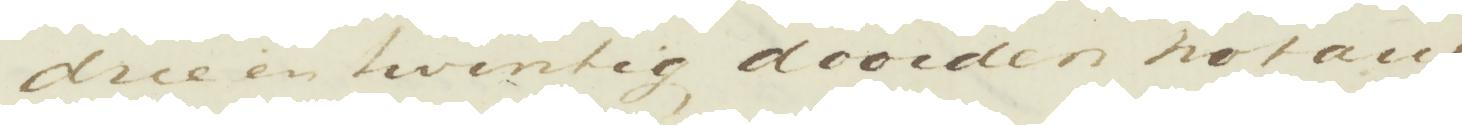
drie en twintig door den notaris
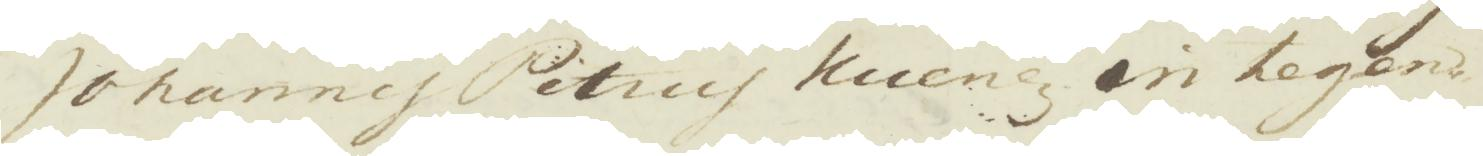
Johannes Petrus Kuenen in tegens
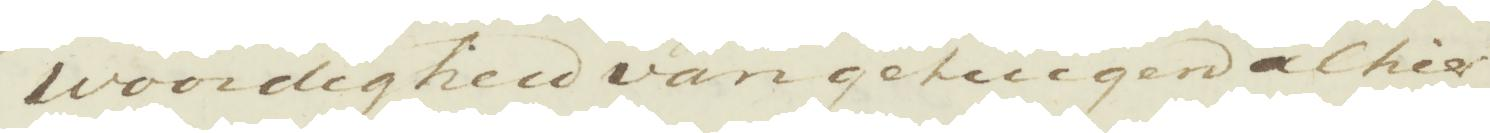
woordigheid van getuigen alhier
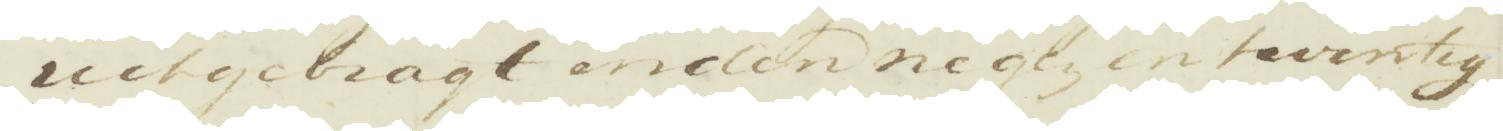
uitgebragt en den negen en twintig
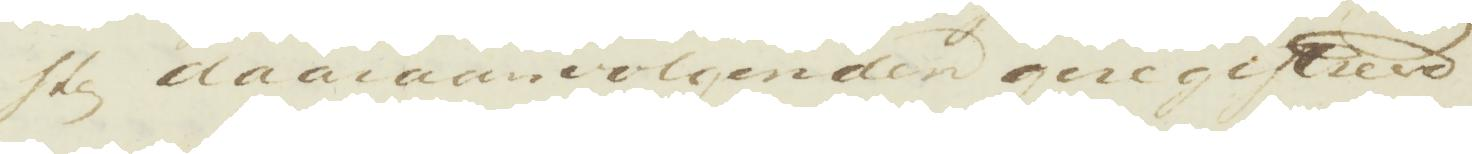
sten daaraanvolgenden geregistreerd
